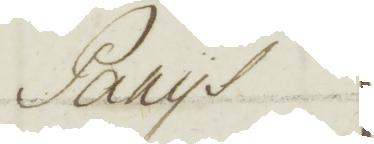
Parijs
